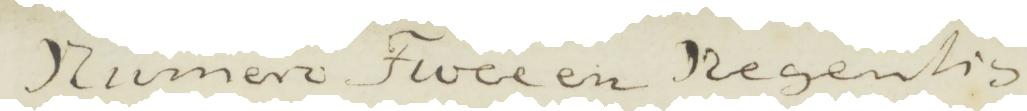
Numero Twee en Negentig
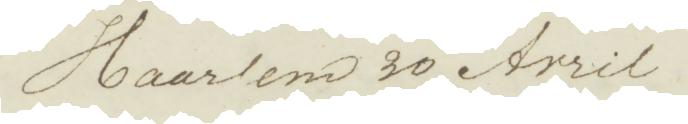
Haarlem 30 April
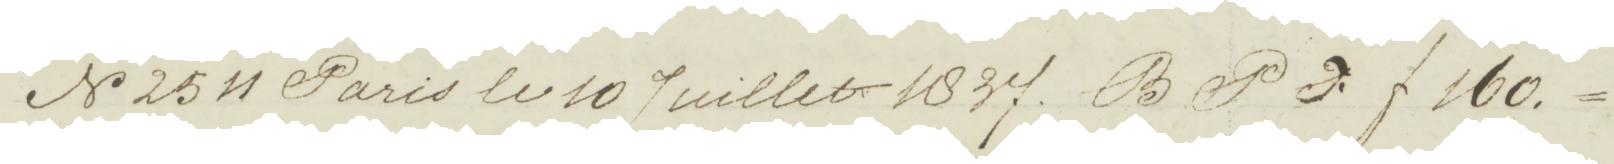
N 2511 Paris le 10 Juillet 1837. B P J ƒ 160. =
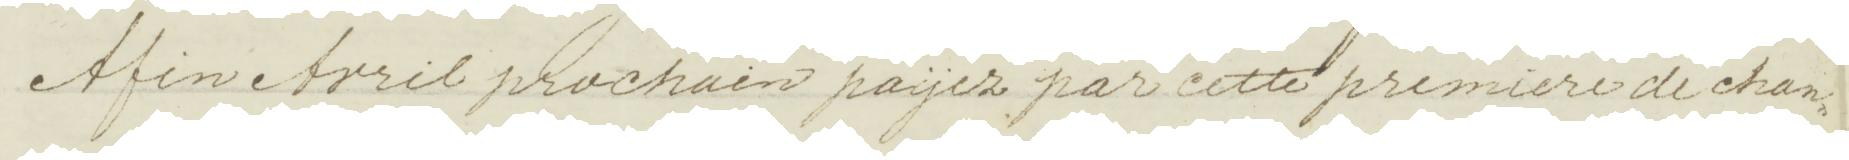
Afin Avril prochain paijez par cette premiere de chan„
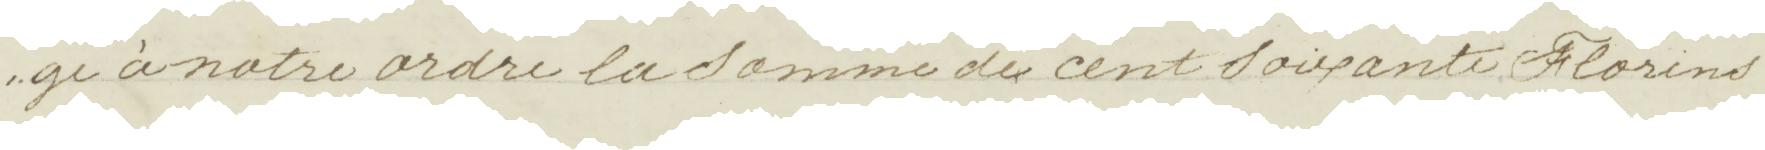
„ge à notre ordre la somme de cent soixante Florins
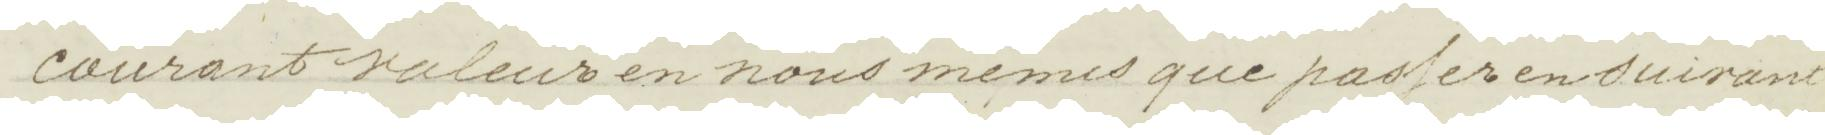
courant valeur en nous memis que passer en suivant
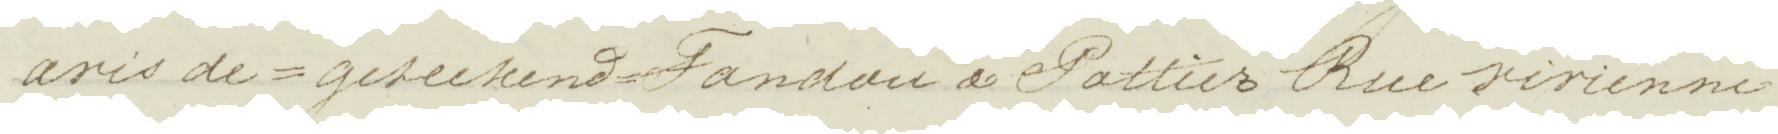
avis de = geteekend = Fandou & Pattier Rue vivienne
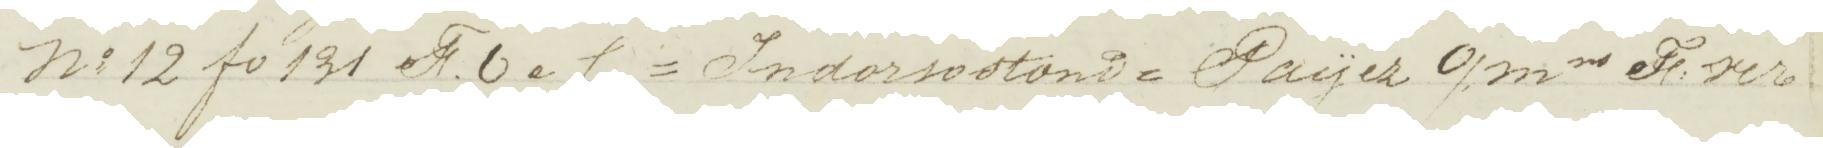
N=o 12 fo 131 Fr. V e C = Jndorso stond = Paijez 9, mrs F: ver
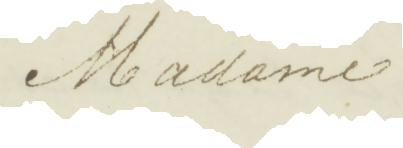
Madame
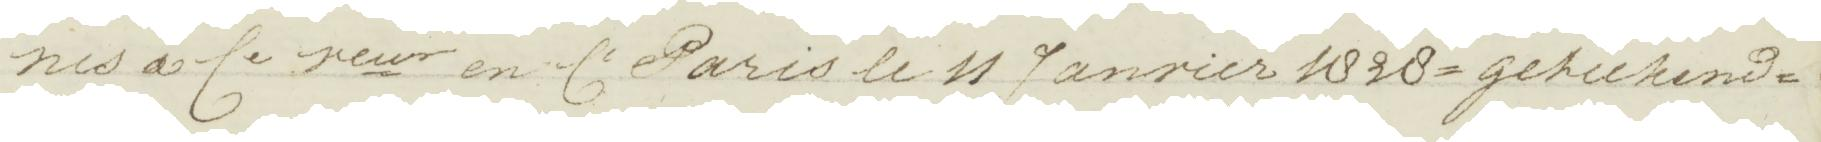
nis a Ce veur en Ce Paris le 11 janvier 1838 = geteekend =
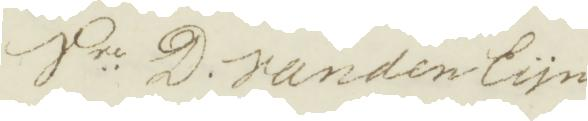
V„re D. vanden Eijn
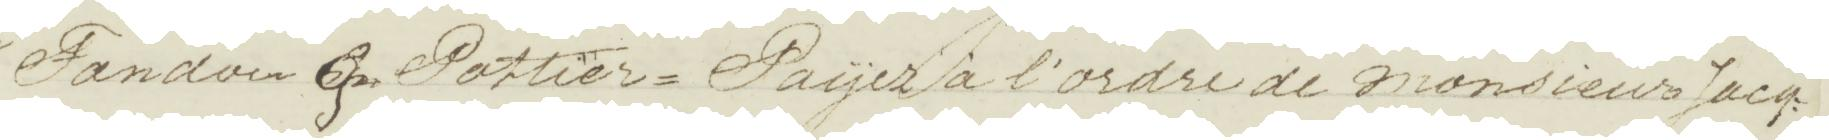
Fandou & Pattier = Paijez à l'ordre de monsieur Jacq:
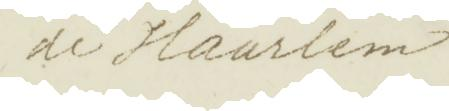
de Haarlem
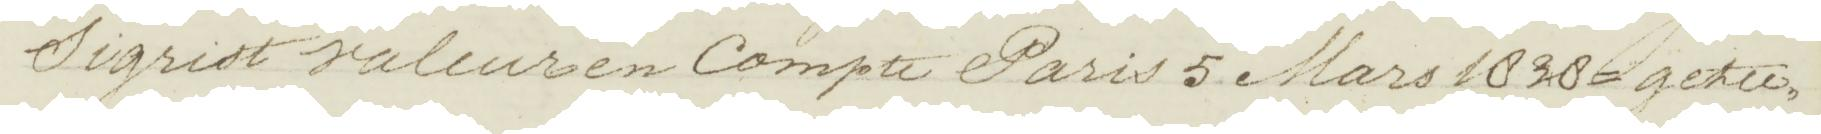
Sigrist valeur en compte Paris 5 Mars 1838 = getee„
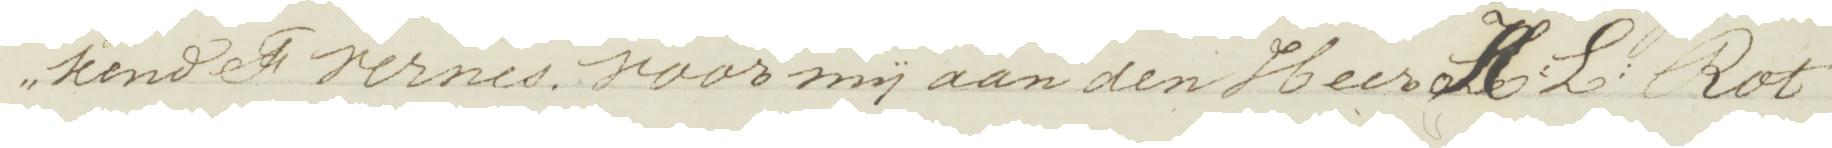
„kend F Vernis, voor mij aan den Heer H: L: Rot
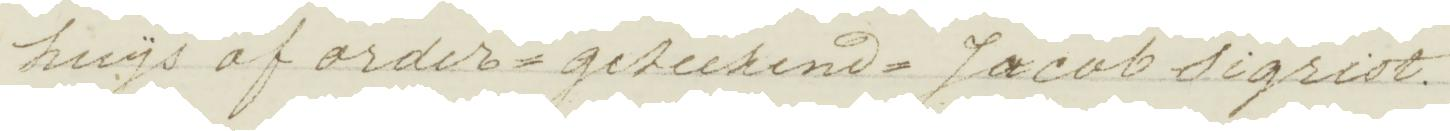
huijs of order = geteekend = Jacob Sigrist.
